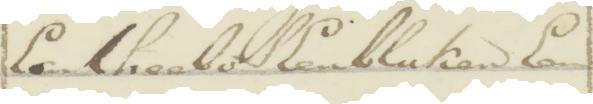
Een theebos Een blaker Een
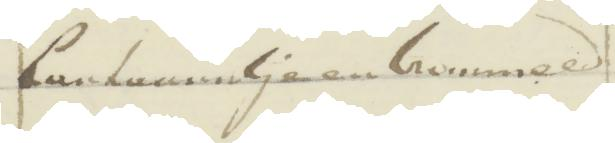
lantaarntje en trommel
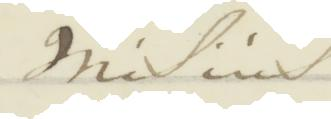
Misius
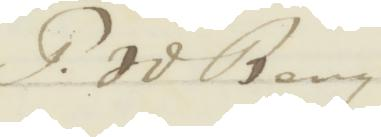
P. vd Berg
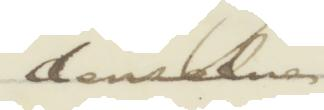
denzelve
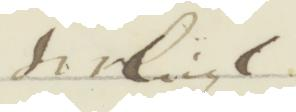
Vd vlugt
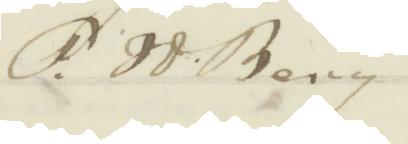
P. vd. Berg
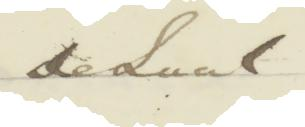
de Laat
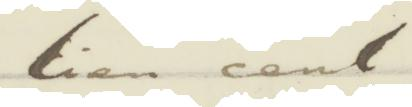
tien cent
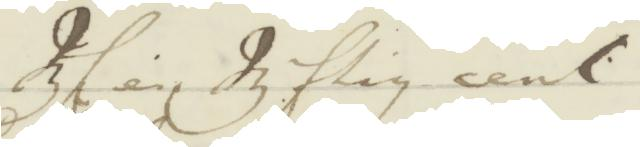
Vyf en Vyftig cent
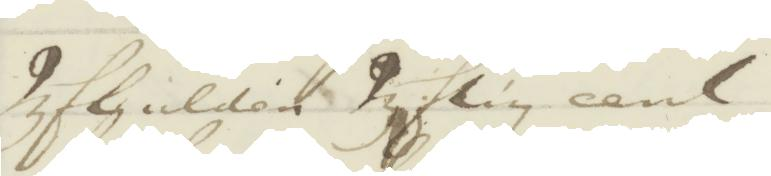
Vyf Gulden Vyftig cent
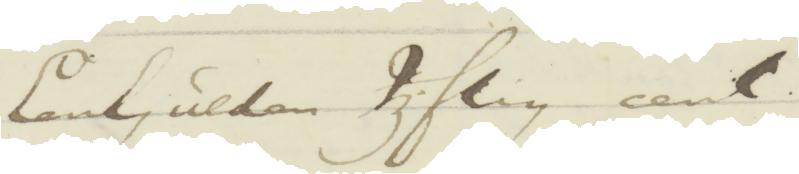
EenGulden Vijftig cent
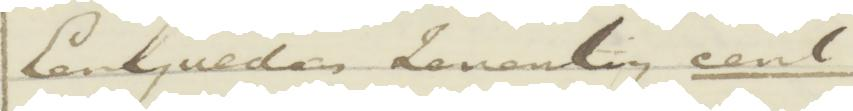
EenGulden zeventig cent
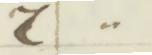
7 ..
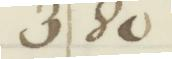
3 80
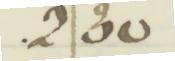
.2 30
